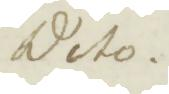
Dito. . . . . . . .
